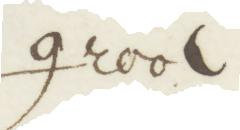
groot
